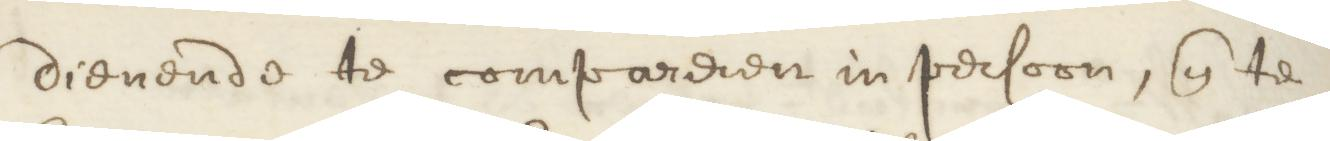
dienende te compareren in persoon, ende te
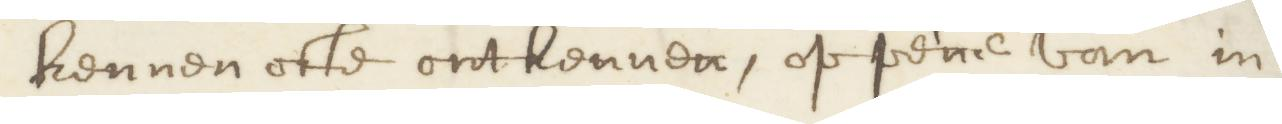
kennen ofte ontkennen, op pene van in
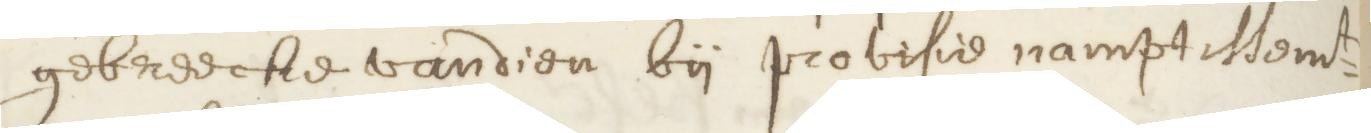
gebreecke van dien bij provisie namptissem=t
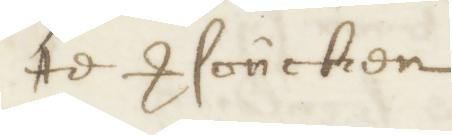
te versoucken
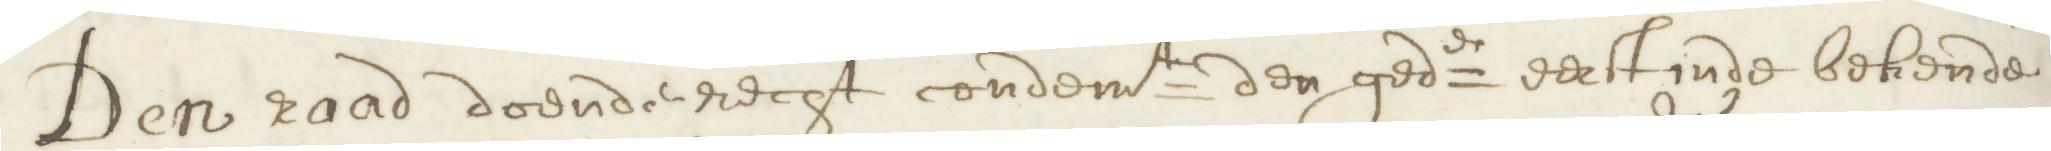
Den raad doende recht condem=t den ged=e eerst inde bekende
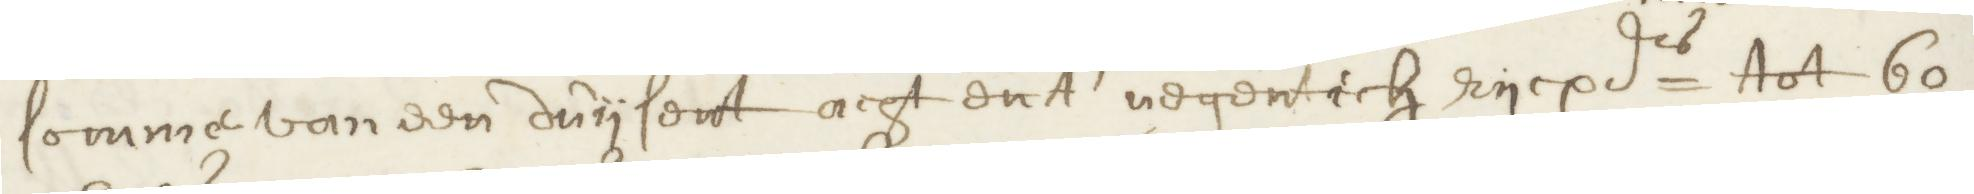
somme van een duijsent acht en t' negentich rijcxd=rs tot 60
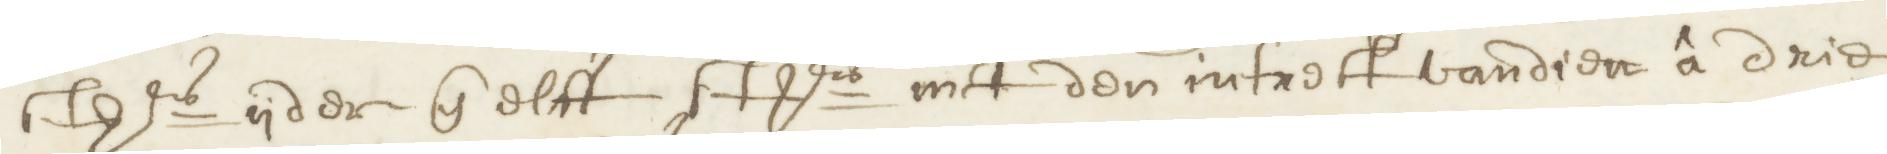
stv=rs ijder ende elff st=rs met den intrest vandien â drie
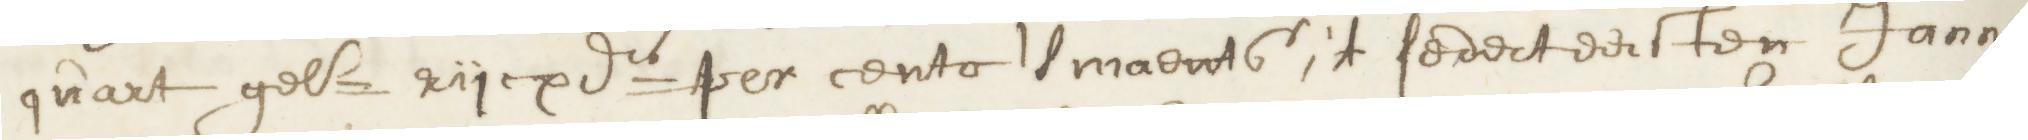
quart gelijk rijcxd=rs per cento 's maents, ’t sedert eersten Jann:
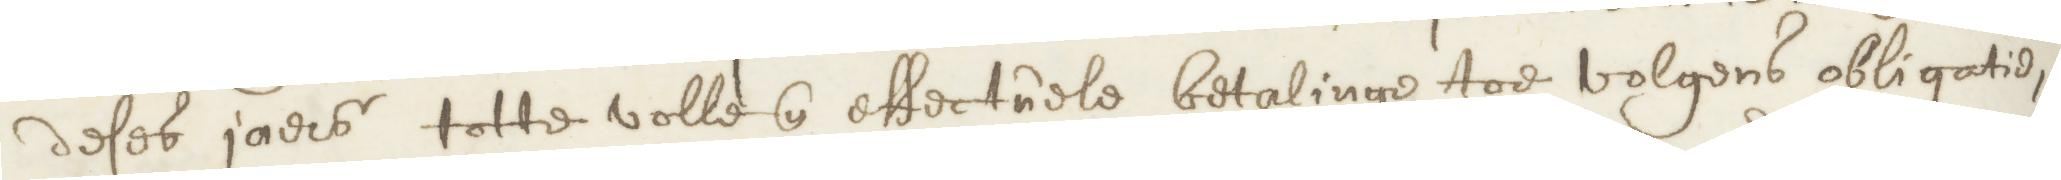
deses jaers totte volle ende effectuele betalinge toe volgens obligatie,
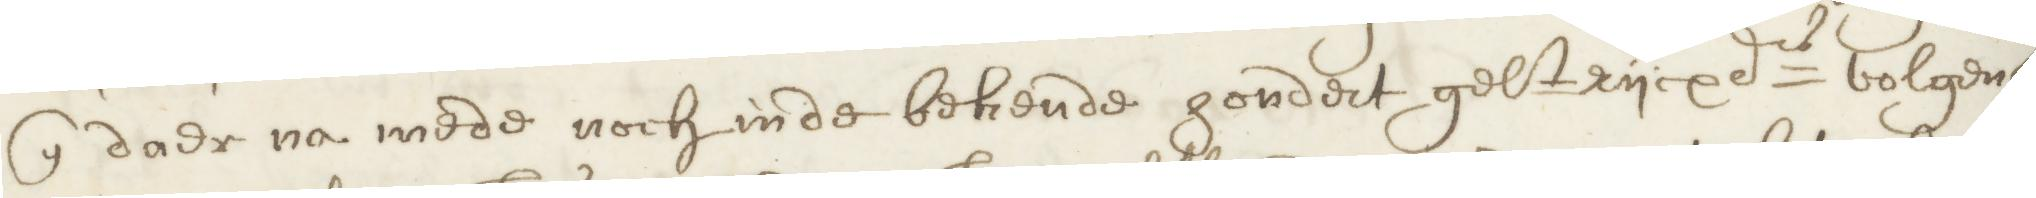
ende daer na mede noch in de bekende hondert gelijk rijcxd=rs volgens
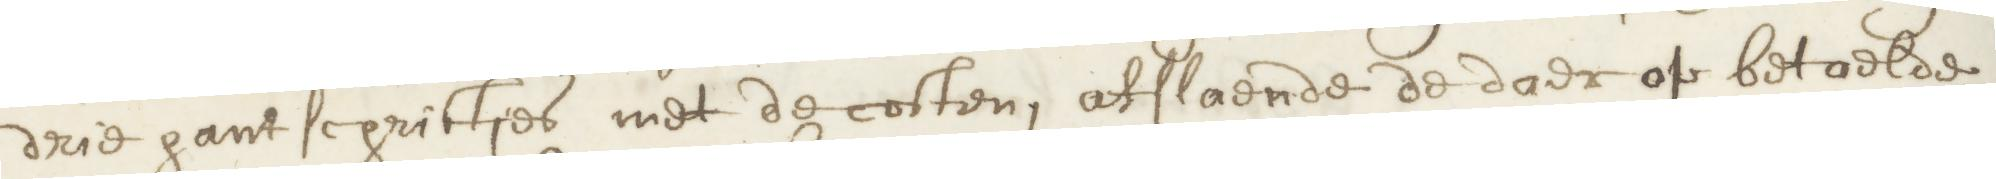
drie hant schriftjes met de costen, afslaende de daer op betaelde
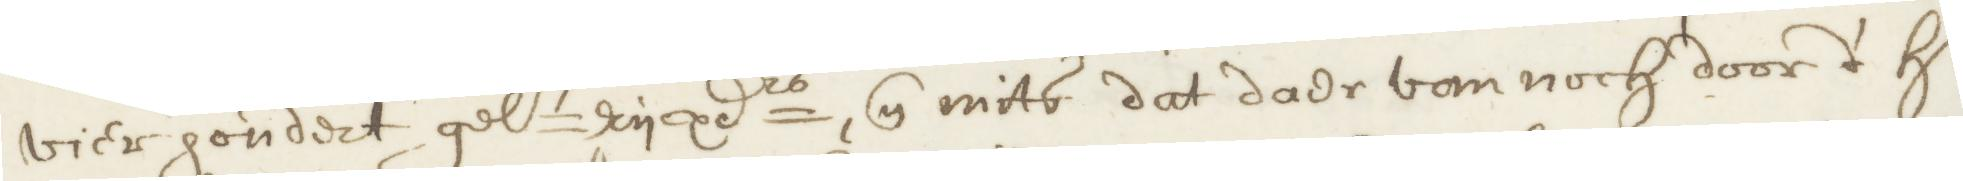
vier hondert gelijk rijcxd=rs, ende mits dat daer van noch door t' h=r
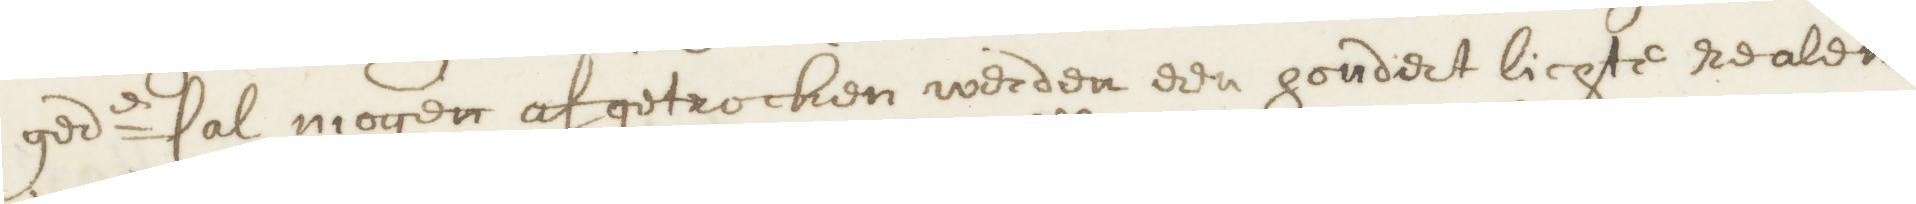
ged=e sal mogen afgetrocken werden een hondert lichte realen
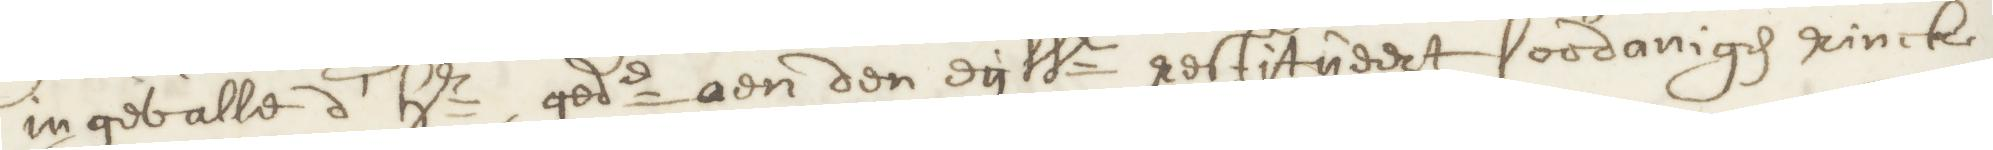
in gevalle d’ h=r ged=e aen den eijss=r restitueert soodanigen rinck
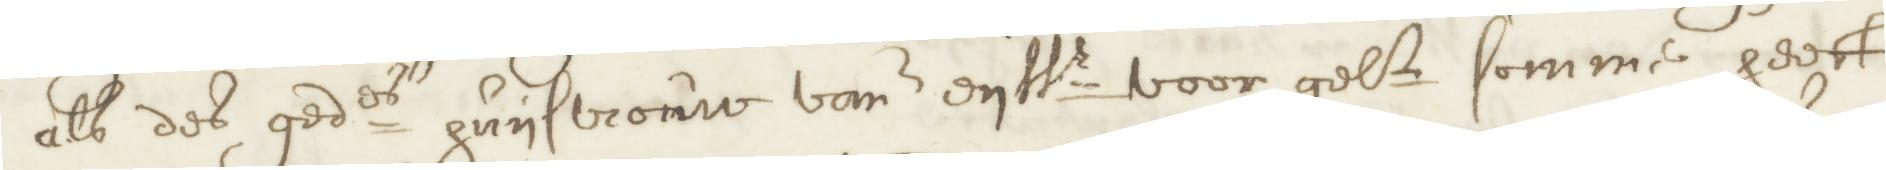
als des ged=es huijsvrouw van eyss=r voor gelijk somme heeft
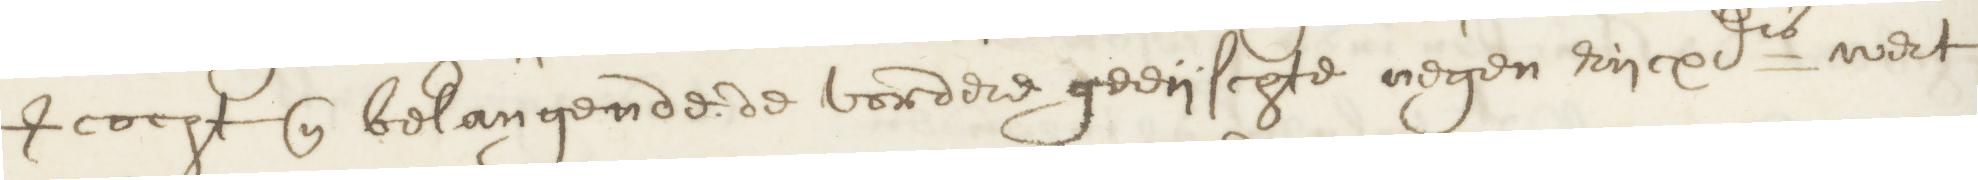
vercocht ende belangende de vordere geeijschte negen rijcxd=rs wert
